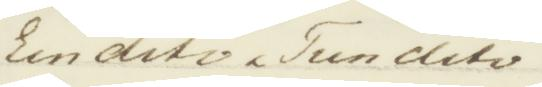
Een dito & Tien dito
